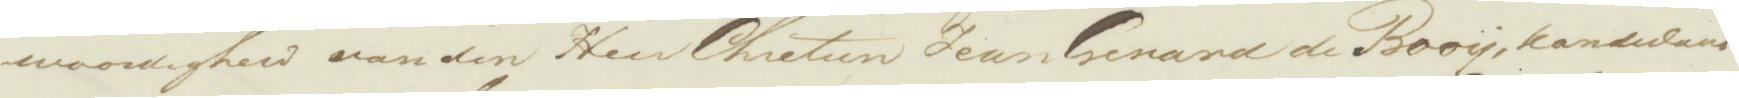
woordigheid van den Heer Chretien Iean Gerard de Booij, kandidaat
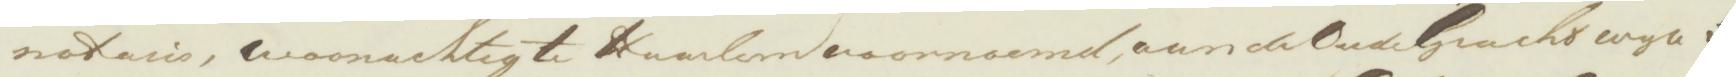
notaris, woonachtig te Haarlem voornoemd, aan de Oude Gracht wyk 5
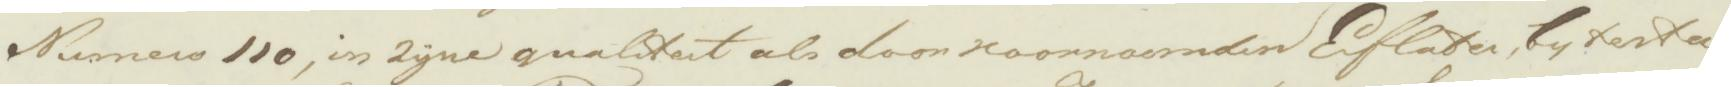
Numero 110, in zijne qualiteit als door voornoemden Erflater, by testa
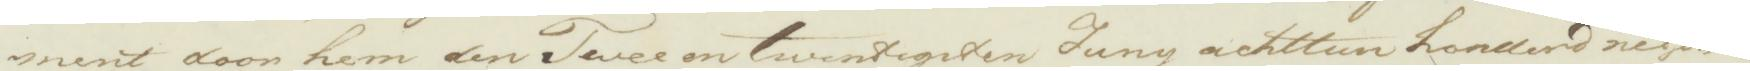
ment door hem den Twee en twintigsten Iuny achttien honderd negen en
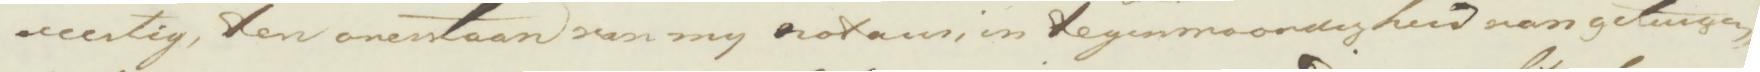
veertig, ten overstaan van my notaris, in tegenwoordigheid van getuigen,
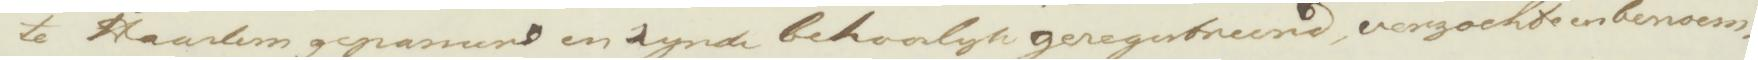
te Haarlem gepasseerd en zynde behoorlyk geregistreerd, verzocht en benoem
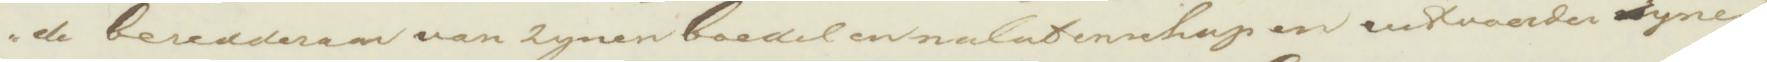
„de beredderaar van zynen boedel en nalatenschap en uitvoerder zyner
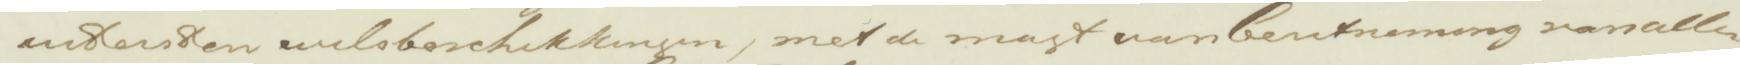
uitersten wilsbeschikkingen, met de magt van bezitneming van allen
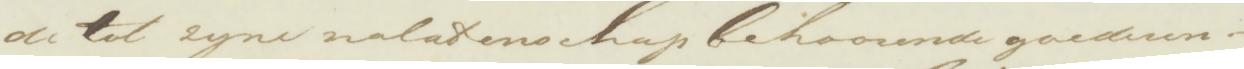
de tot zyne nalatenschap behoorende goederen.
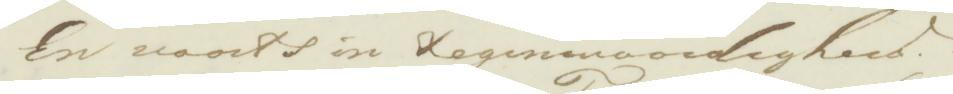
En voorts in tegenwoordigheid.
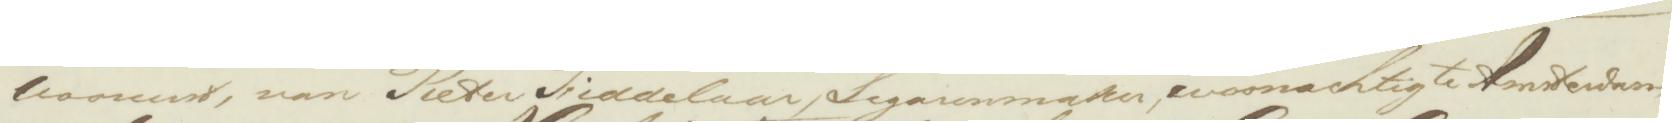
vooreerst, van Pieter Fiddelaar, Sigarenmaker, woonachtig te Amsterdam
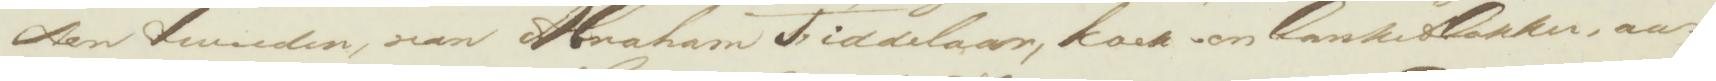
ten tweeden, van Abraham Fiddelaar, koek- en banketbakker, aan
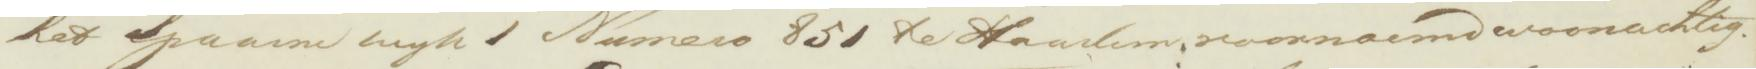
het Spaarne wyk 1 Numero 851 te Haarlem, voornoemd woonachtig
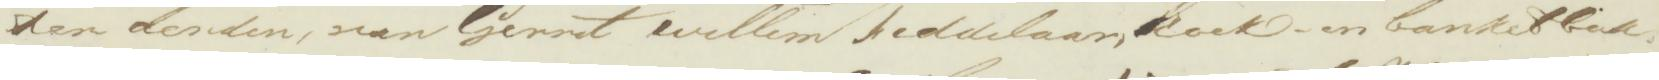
ten derden, van Gerrit willem Fiddelaar, koek- en banketbak
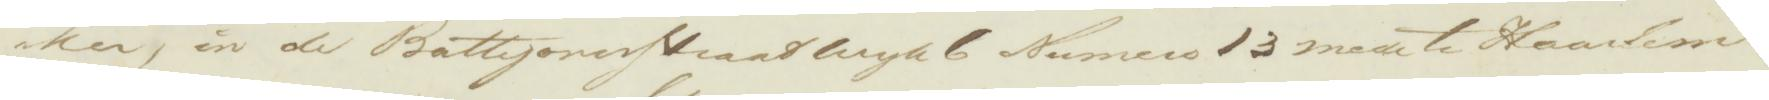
ker, in de Battejorisstraat wyk 6 Numero 13 mede te Haarlem
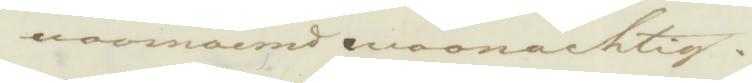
voornoemd woonachtig.
